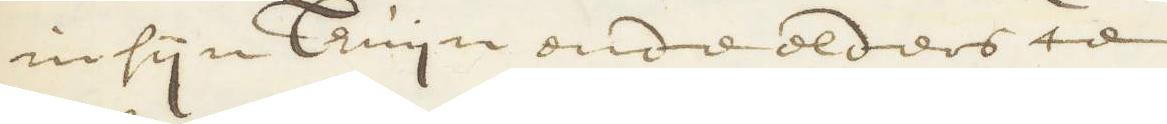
in sijn Thuijn ende elders te
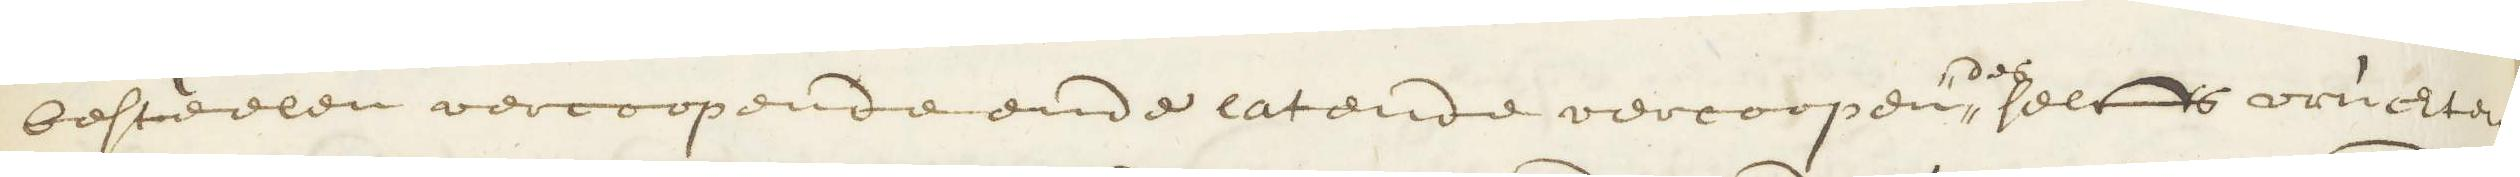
besteelen vercoopende ende latende vercoopen„ selffs vruchten
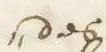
„ des
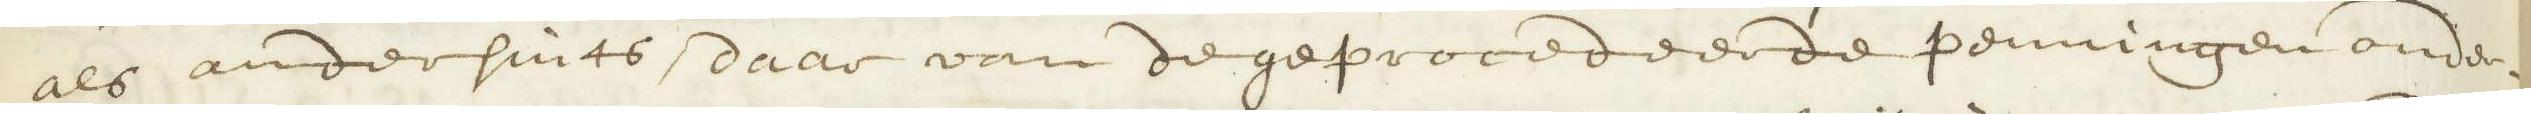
als andersints, daar van de geprocedeerde penningen onder
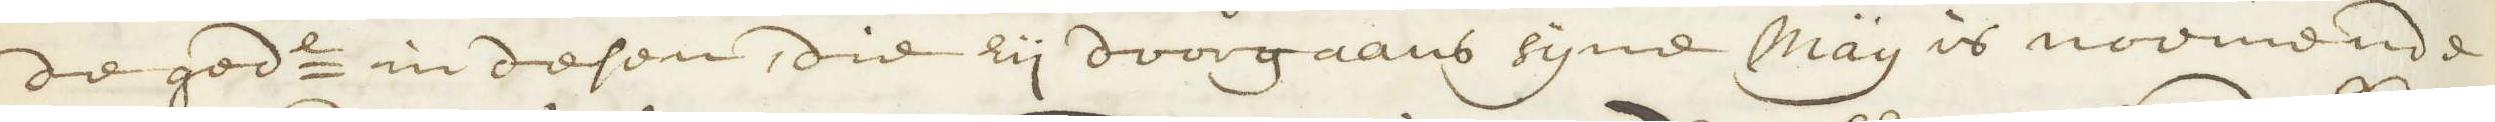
de ged=e in desen, die hij doorgaans sijne maij is noemende
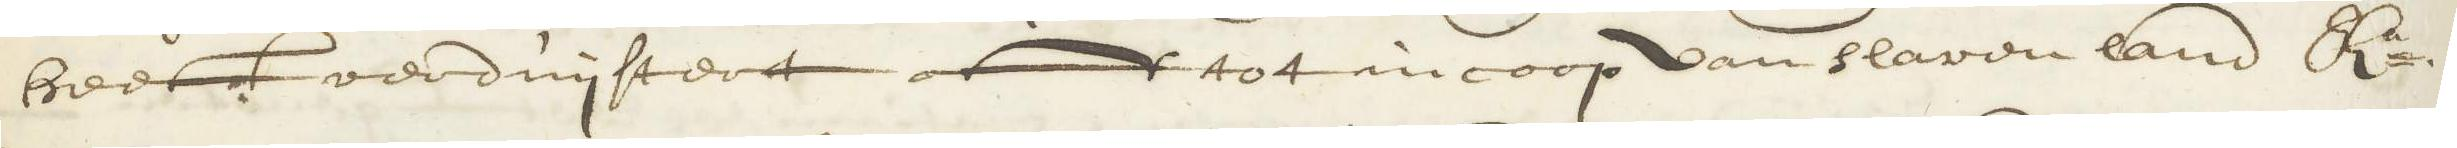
heeft verduijstert off tot incoop van slaven land R=a
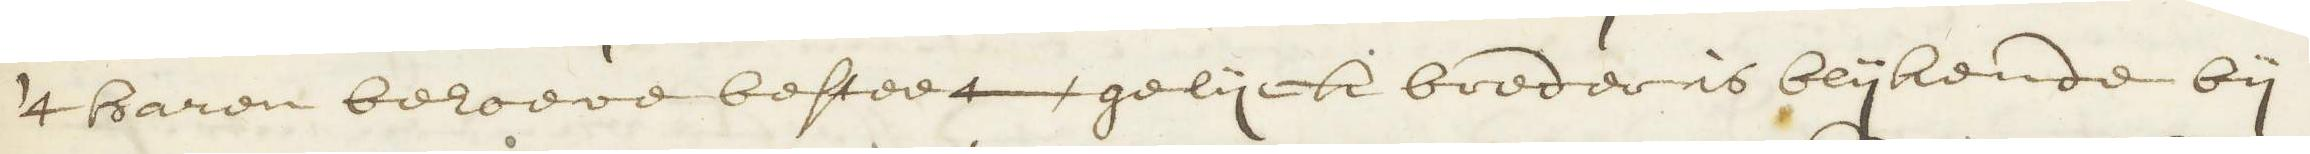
’t haren behoeve besteet, gelijck boeder is blijkende bij
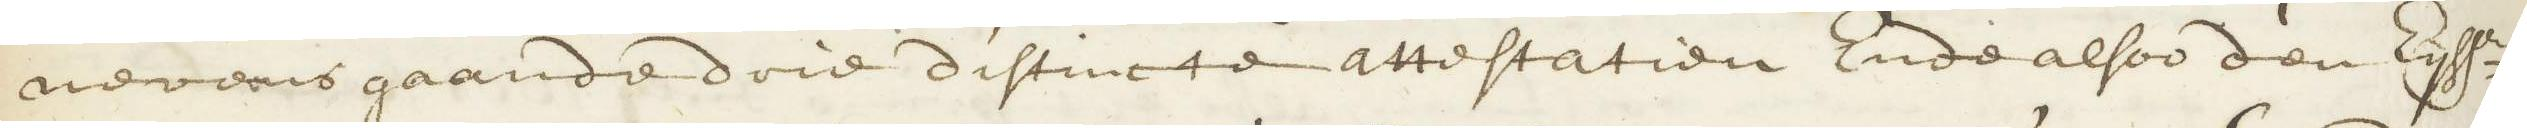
nevens gaande drie distincte attestatien Ende alsoo den Eijss=r
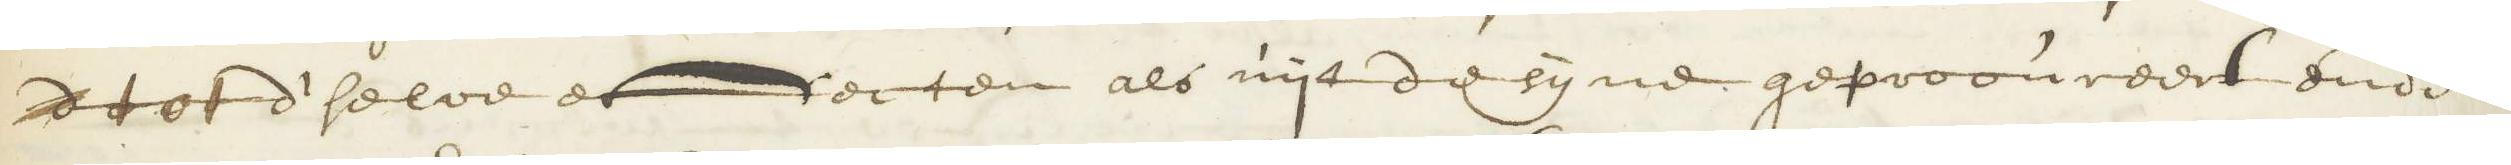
d tot d’ selve effecten als uijt de sijne geprocureert ende
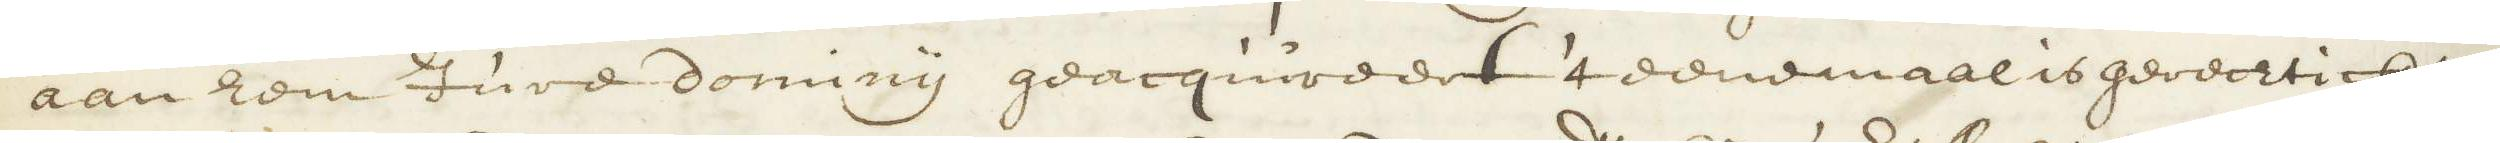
aan hem Iure dominij geacquireert ’t eenemaal is gerechticht
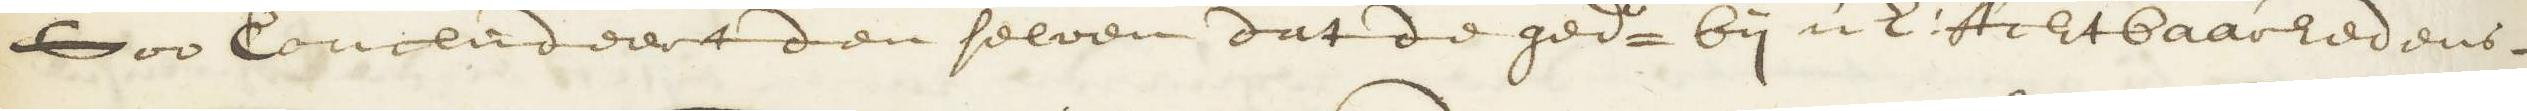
Soo Concludeert den selven dat de ged=e bij u E: Achtbaarhedens
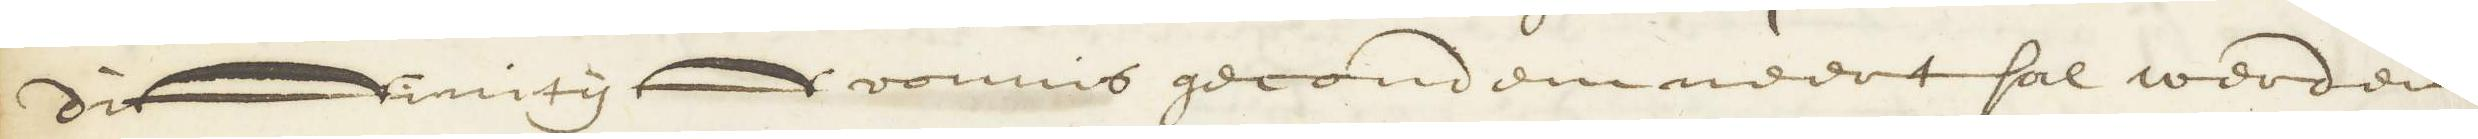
diffinitijff vonnis gecondemneert sal werden
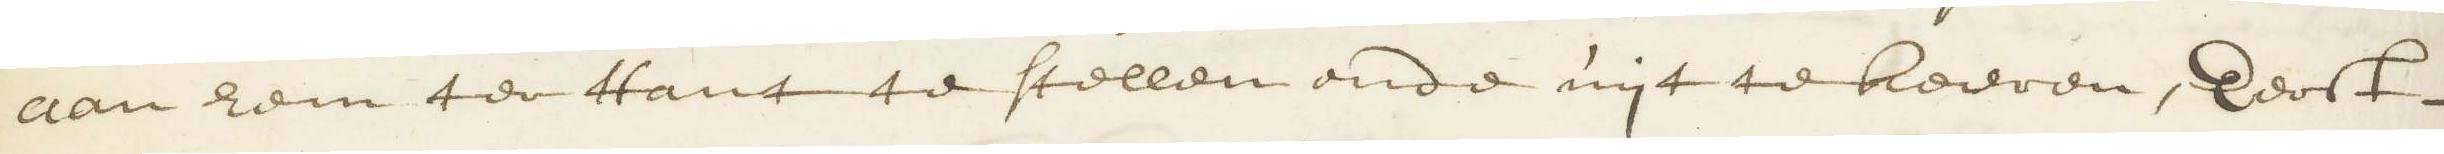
aan hem ter Hant te stellen ende uijt te keeren, Eerst
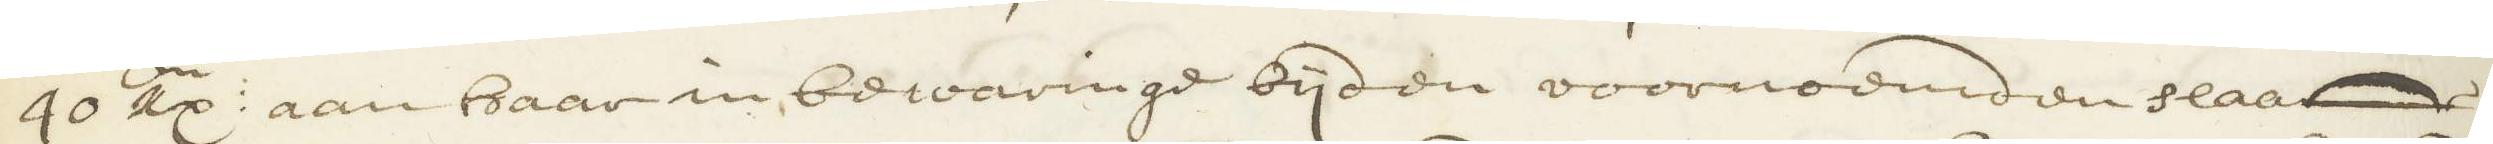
40 rx: aan haar in bewaringe bijden voornoemden slaaff
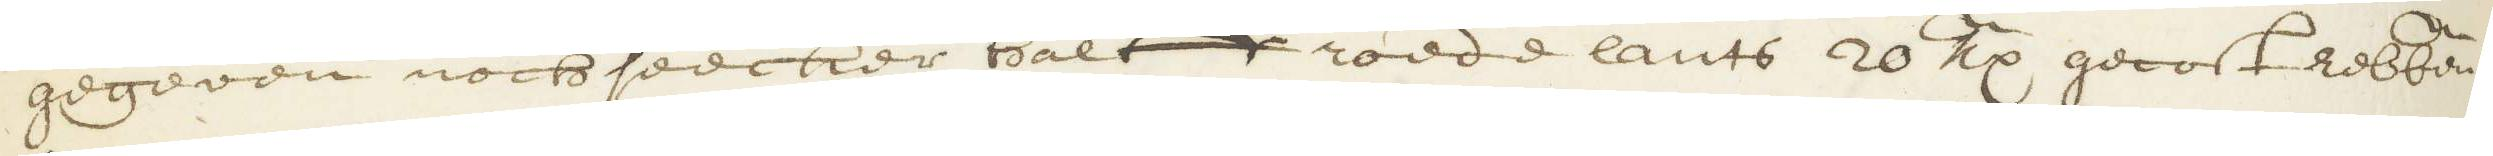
gegeven noch seecker halff roede lants 20 rx gecost hebben:
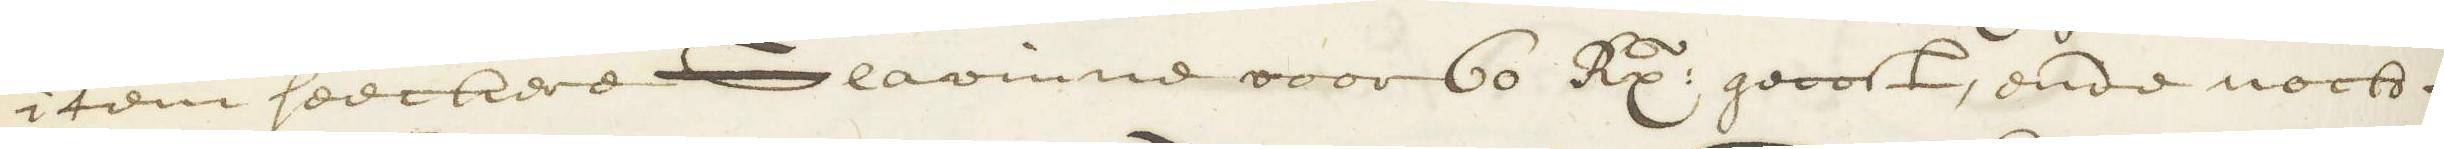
item seeckere Slavinne voor 60 Rx: gecost, ende noch
